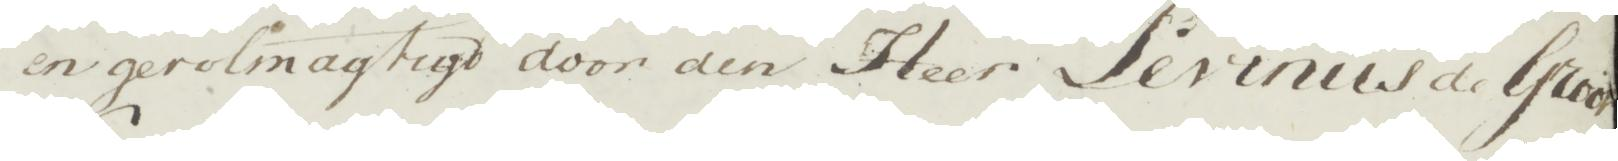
en gevolmagtigd door den Heer Levinus de Groot
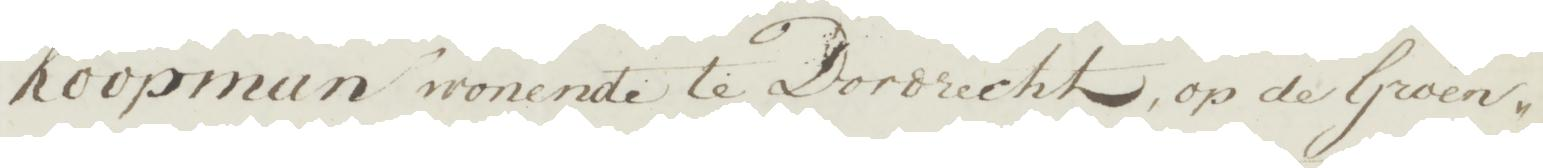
Koopman wonende te Dordrecht, op de Groen„
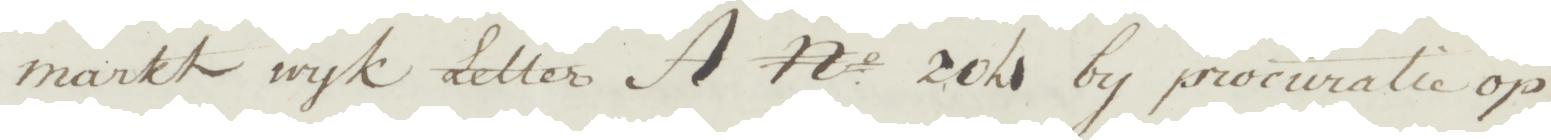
markt wyk Letter A N=o 204 by procuratie op
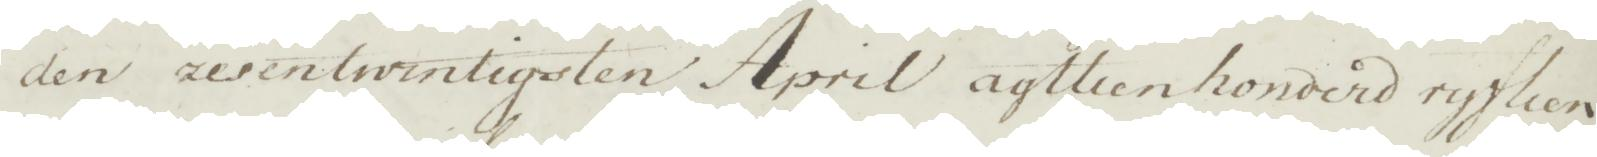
den zes en twintigsten April agttien honderd vyftien
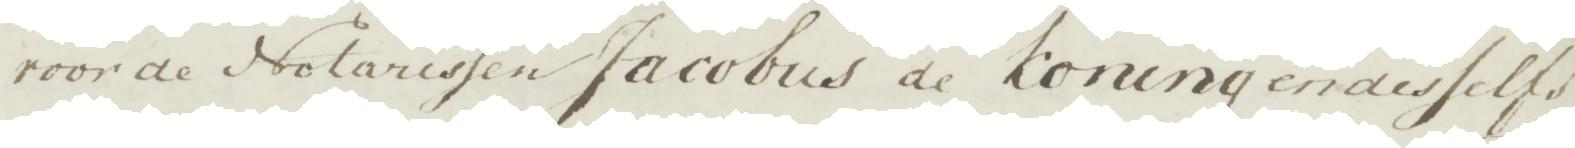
voor de Notarissen Jacobus de Koning en desselfs
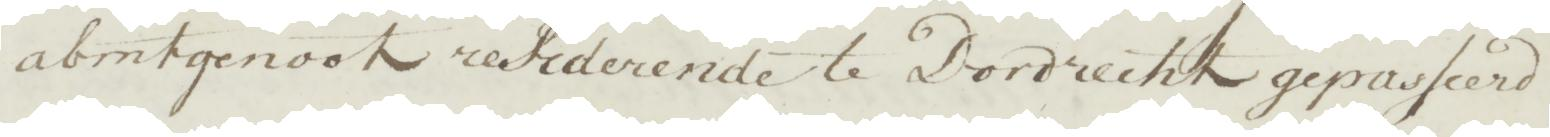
abmtgenoot residerende te Dordrecht gepasseerd
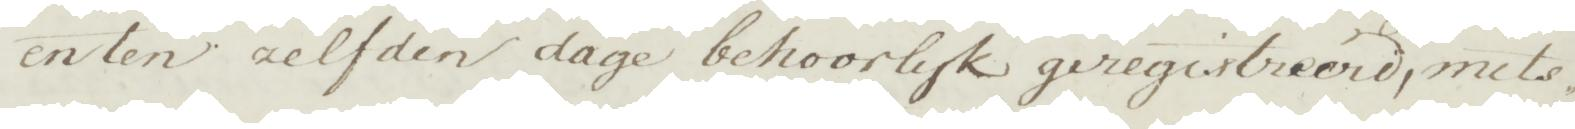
en ten zelfden dage behoorlyk geregistreerd, mits
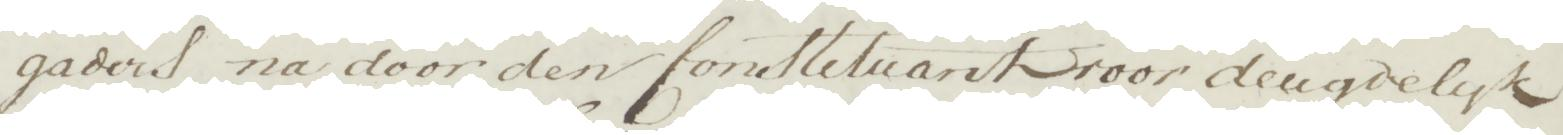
gaders na door den Constituant voor deugdelyk
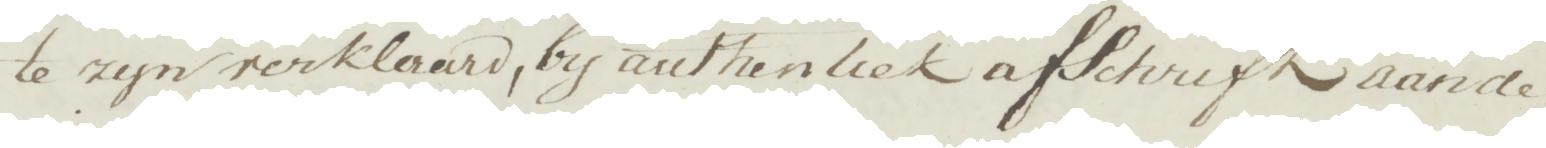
te zyn verklaard, by authentiek afschrift aan de
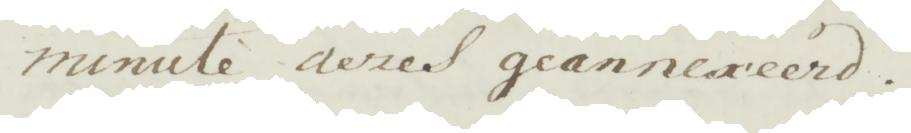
minute dezes geannexeerd.
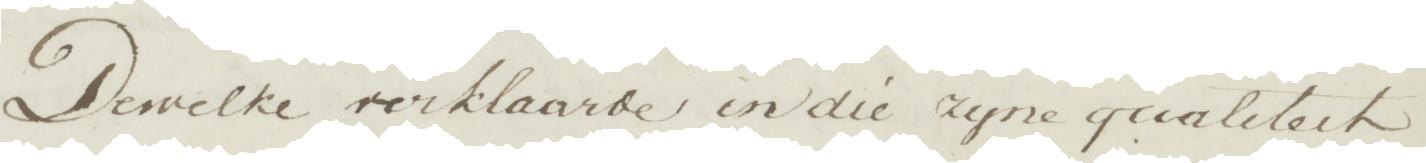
Dewelke verklaarde in die zyne qualiteit
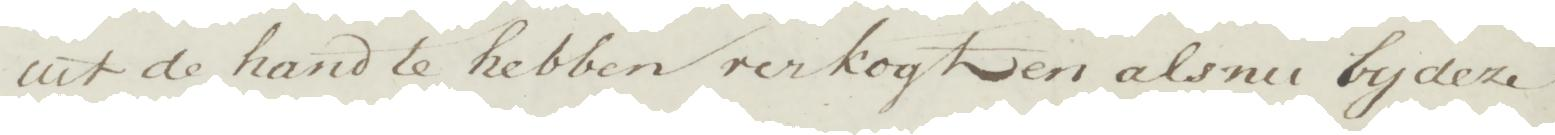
uit de hand te hebben verkogt en als nu by deze
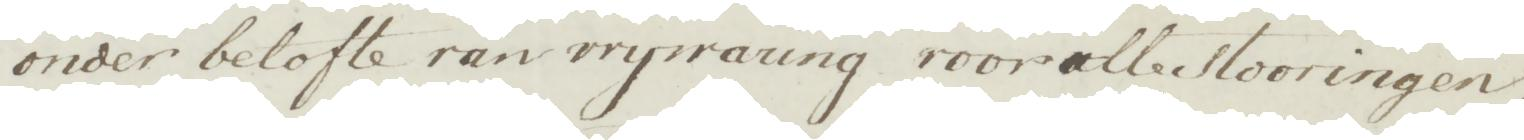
onder belofte van vrywaring voor alle stooringen
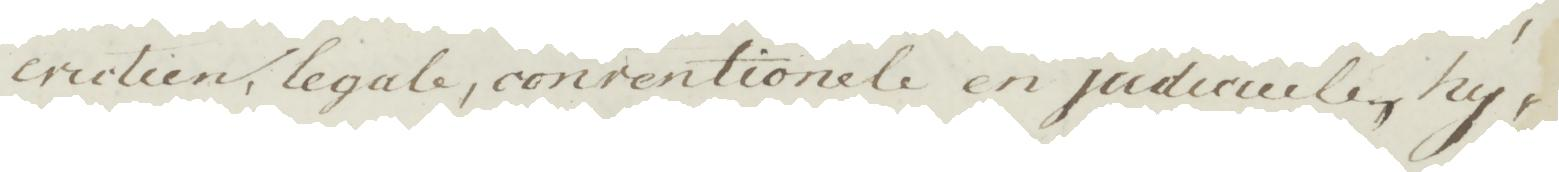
evictien, legale, conventionele en judicieele hy„
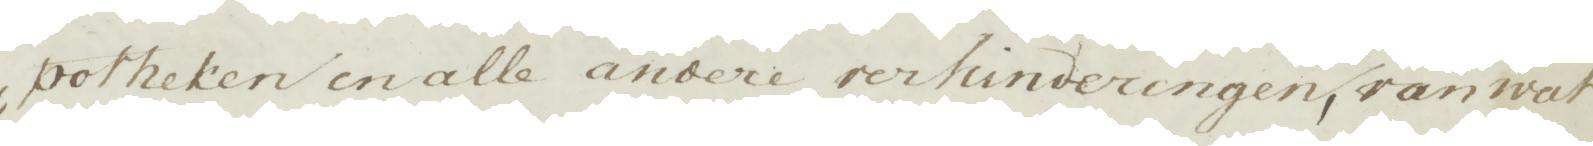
„potheken en alle andere verhinderingen, van wat
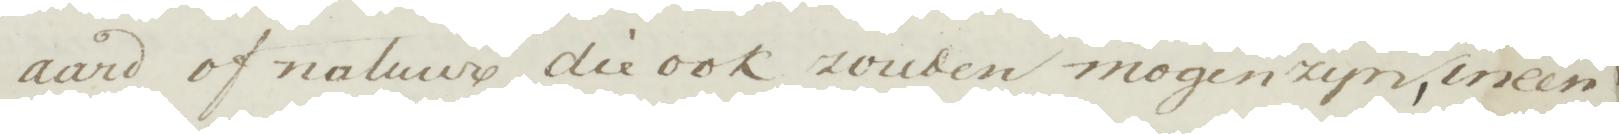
aard of natuur die ook zouden mogen zyn, in een
